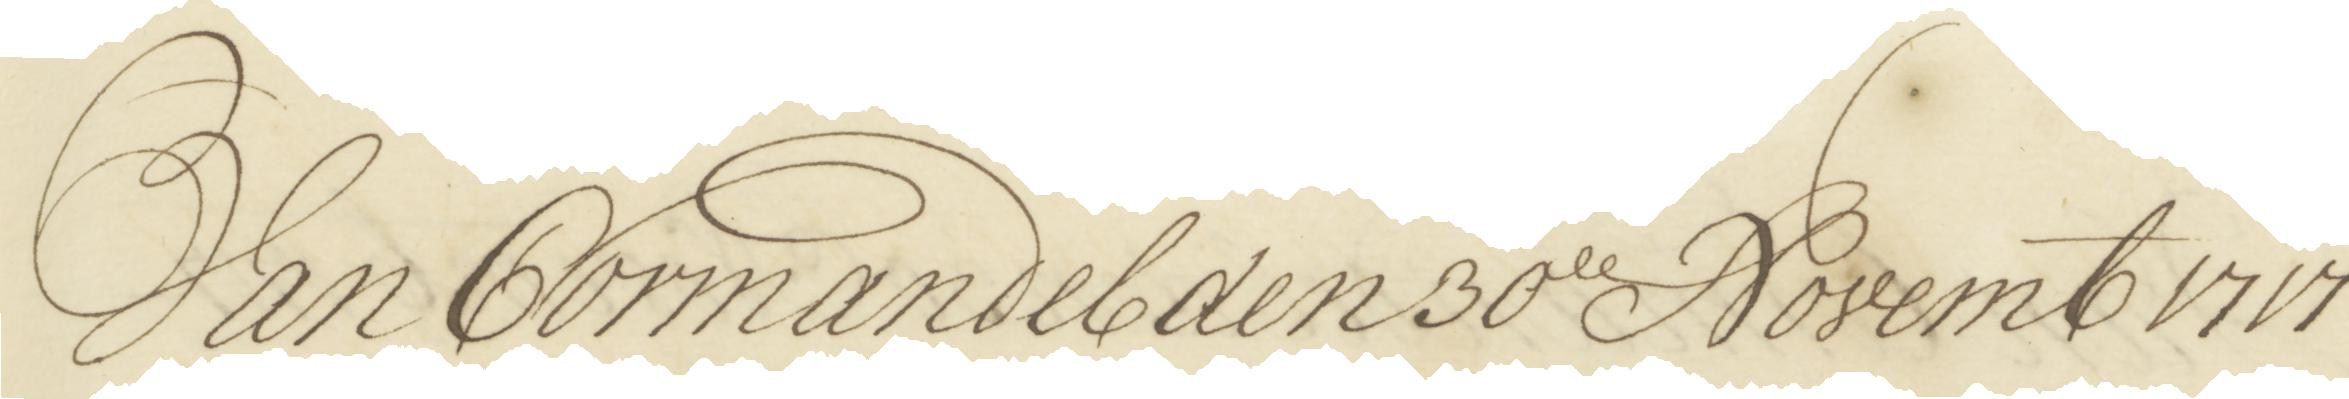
Van Cormandel den 30e Novemb 1717
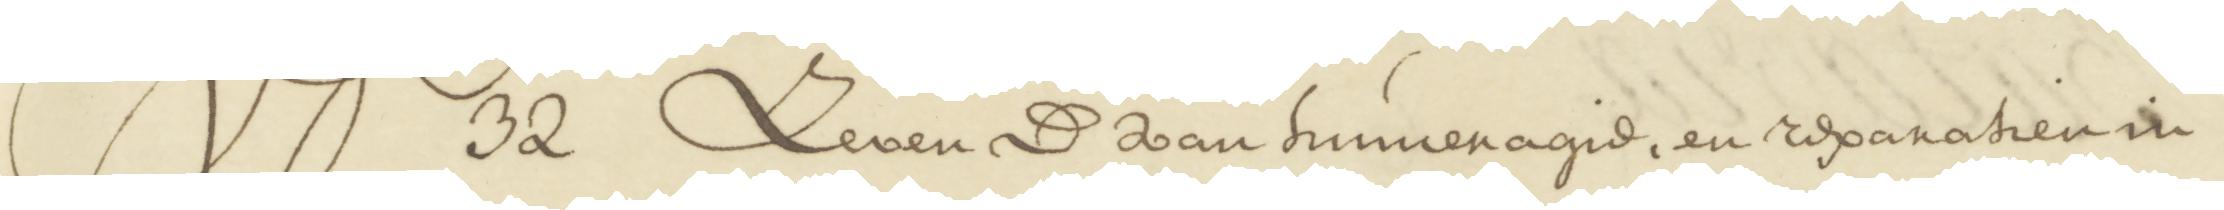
No 32 Zeven E van tnuneragie, en reparatien in
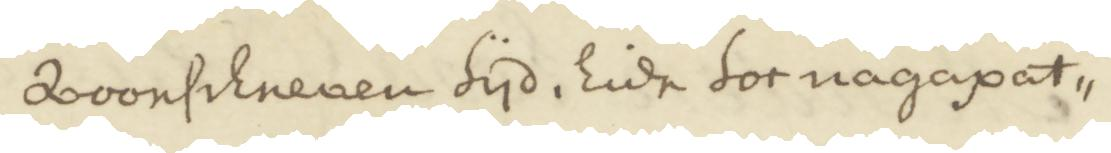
voorschreven tijd, hier tot nagapat„
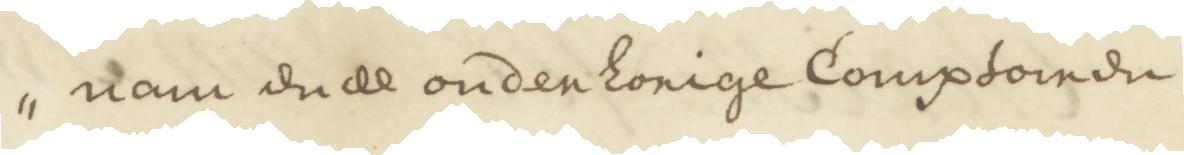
„nam en de onder horige Comptoiren
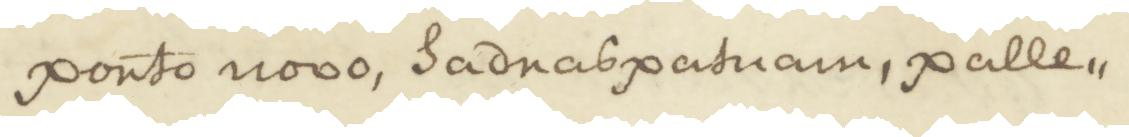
porto novo, sadraspatnam, palle„
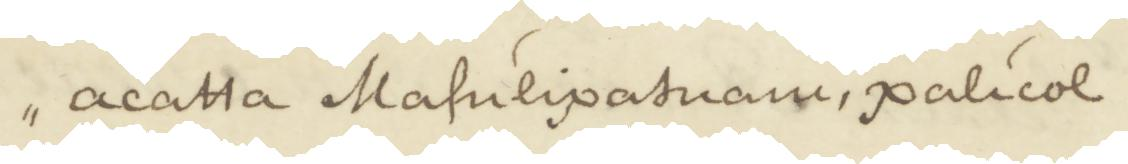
„acatta Masulipatnam, palicol
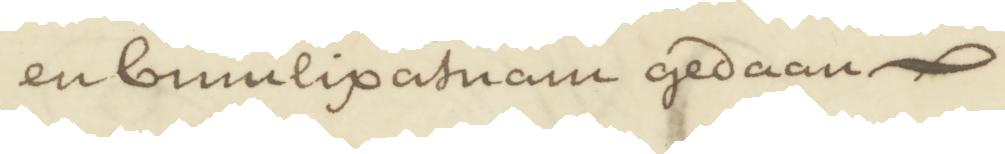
en binulipatnam gedaan —
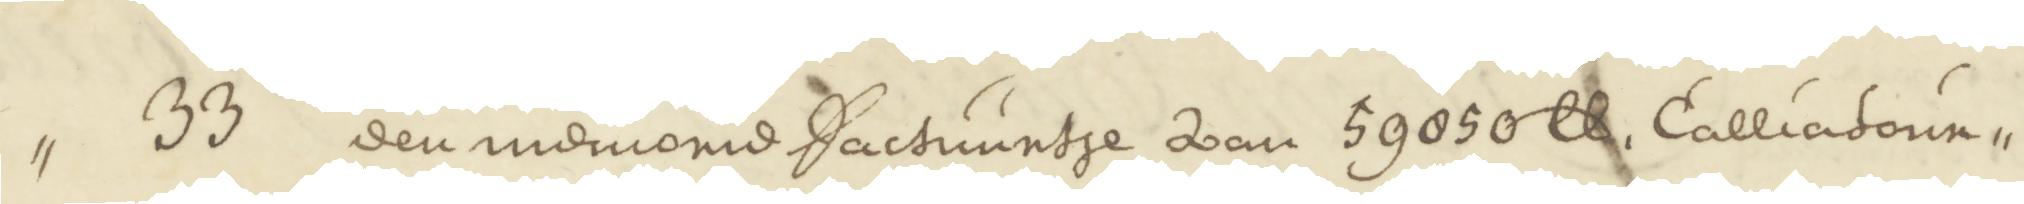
„ 33 een memorie factuurtje van 59850 lb. Calliatour„
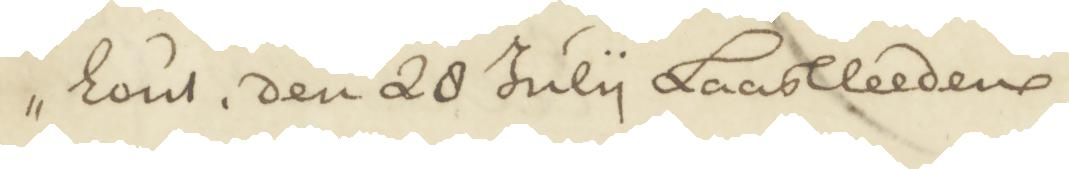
„hout, den 28 Iulij Laastleeden
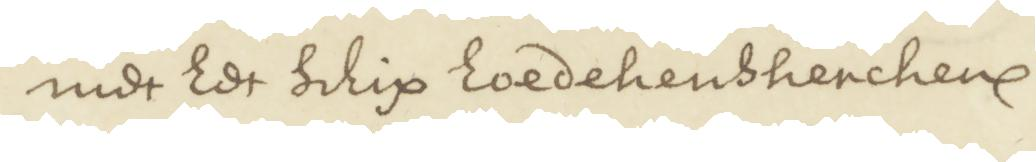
met het schip hoedekenskercken
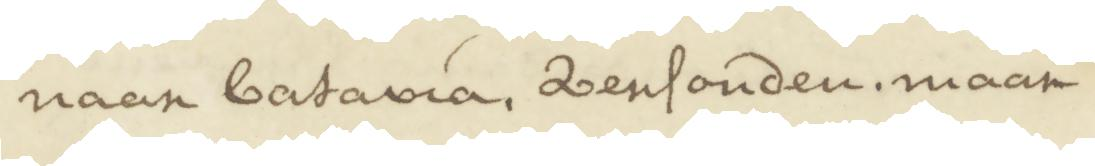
naar batavia, versonden, maar
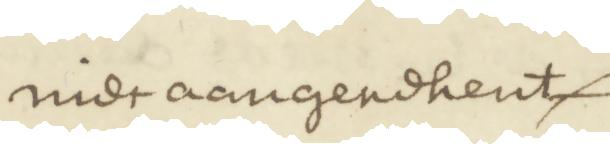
niet aangerekent
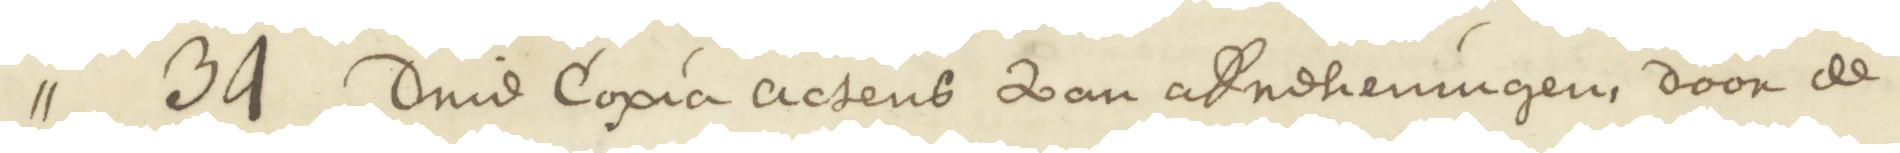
„ 34 drie Copia actens van afrekeningen, door de
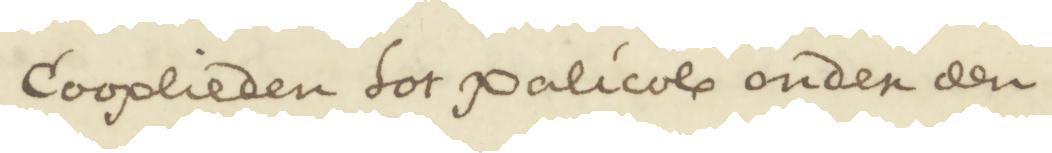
Cooplieden tot palicol onder den
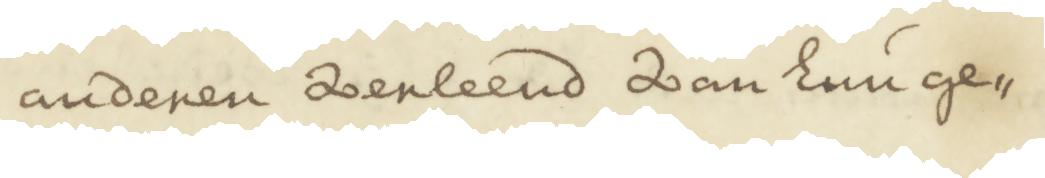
anderen verleend van hun ge„
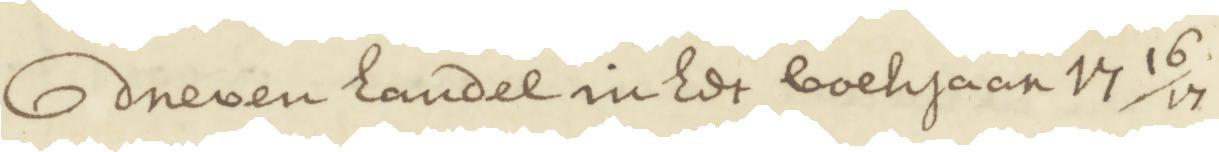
dreven handel in het boekjaar 1716/17
